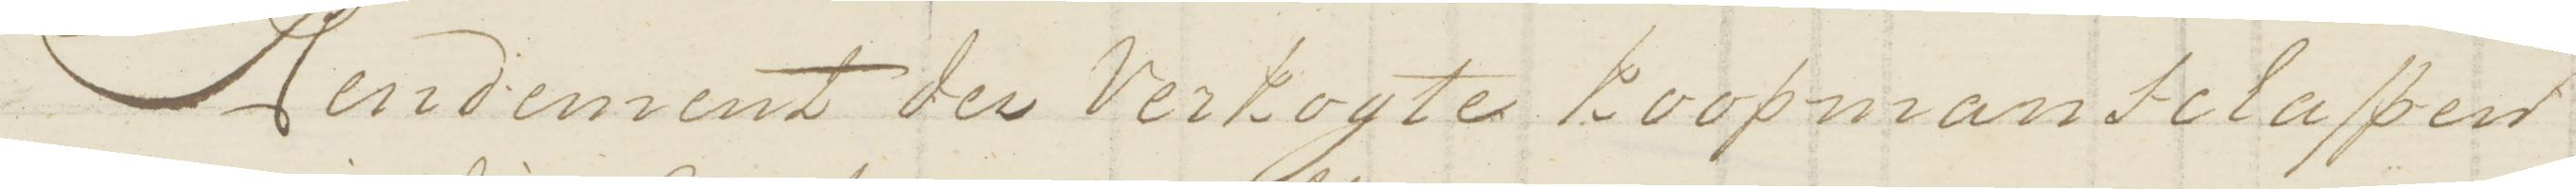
Rendement der Verkogte koopmanschappen
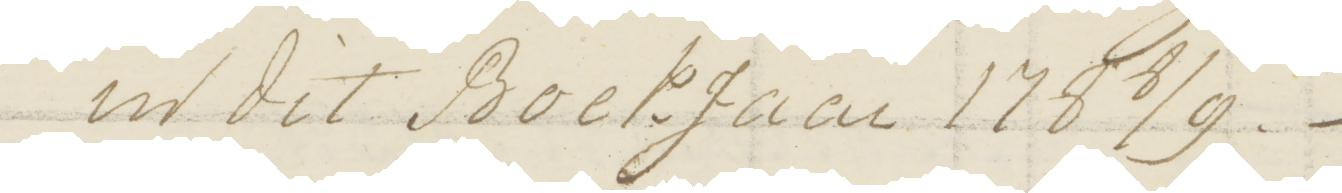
in dit Boekjaar 178 8/9.-
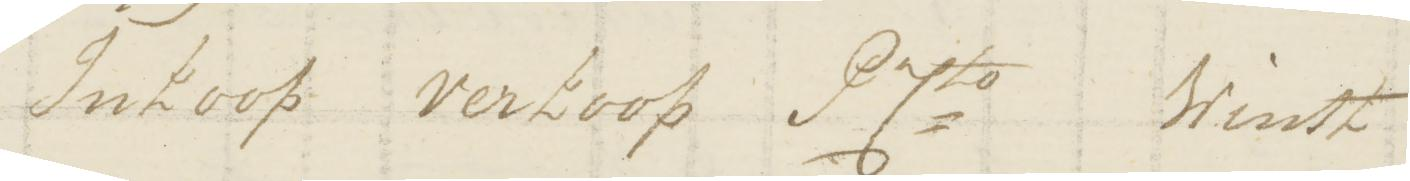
Inkoop verkoop PrC=to Winst
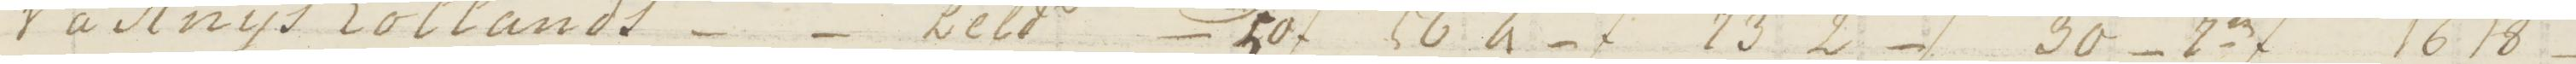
1 á Anijs hollands - - keldr - 49/50 ƒ 56 4 - ƒ 73 2 - f 30 - r-m f 16 18-
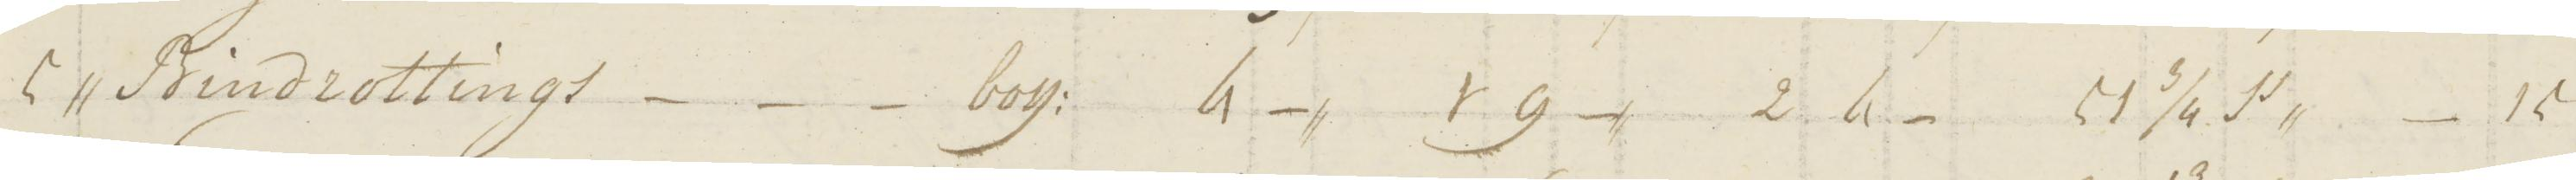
5 „ Bindrottings - - - boy: 4 -„ 1 9 -„ 2 4 - 51 ¾ ps„ - 15
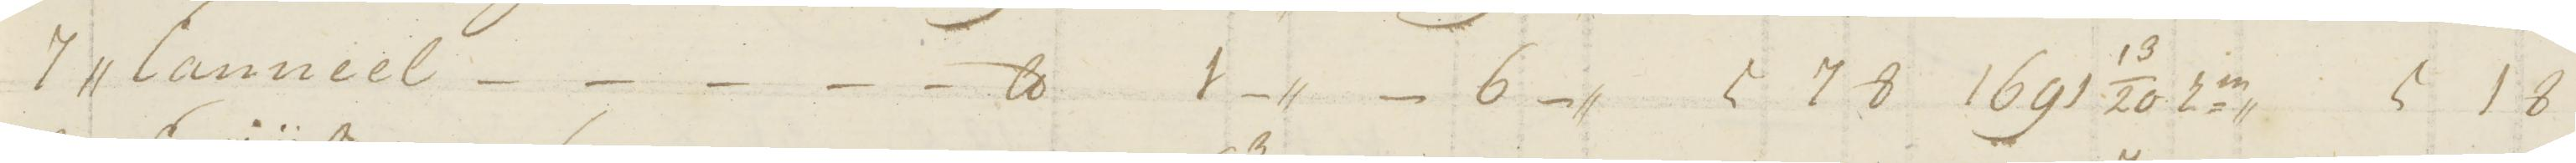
7 „ Canneel - - - - - lb 1 - „ - 6 -„ 5 7 8 1691 13/20 r=m „ 5 18
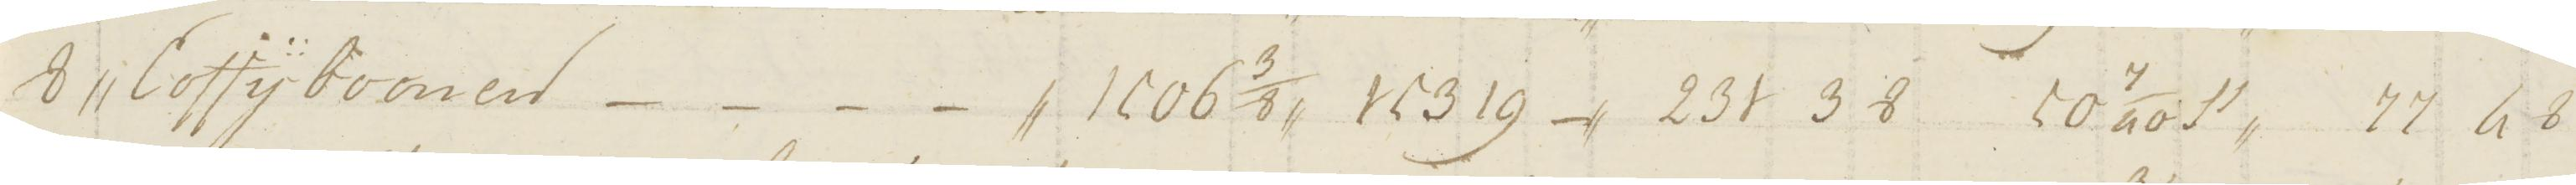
8 „ Coffijboonen - - - - „ 1506 3/8 „ 15319 -„ 231 3 8 50 7/40 ps „ 77 4 8
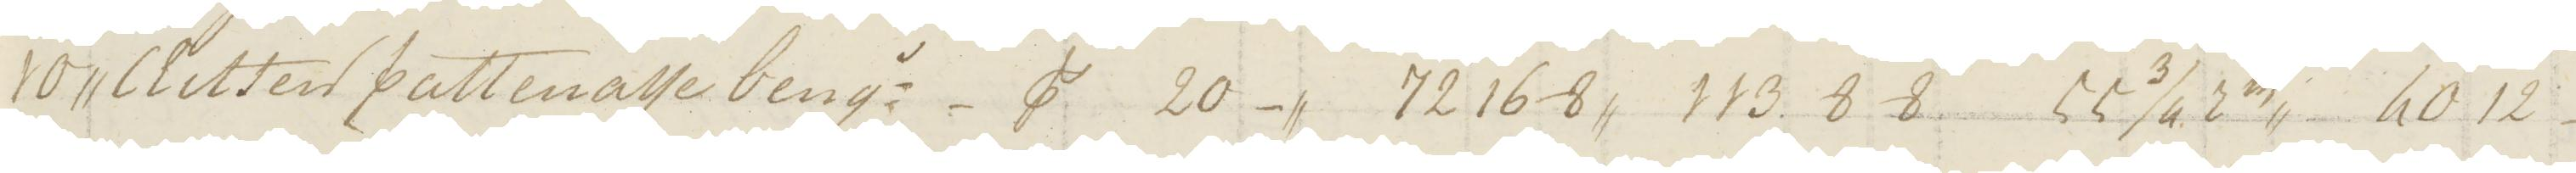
10„ Chitten pattenatje beng=s - p:s 20 -„ 72168 „ 113 8 8 55¾ rm 40 12 -
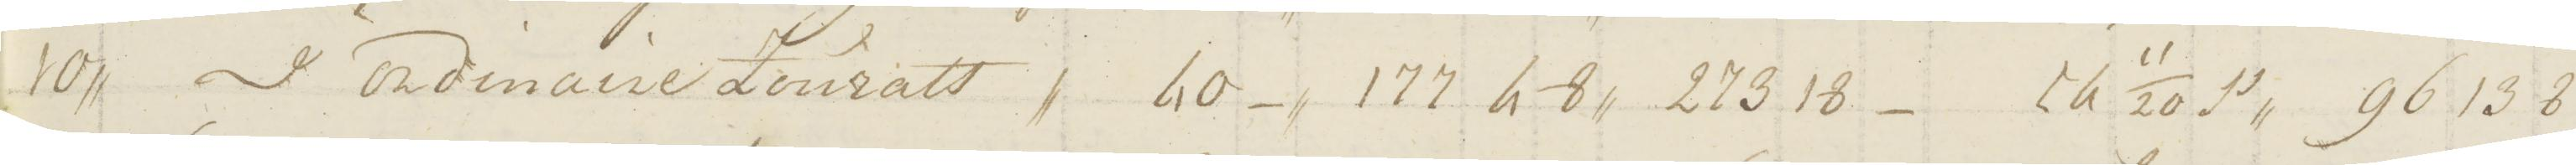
10 „ _o ordinaire zourats „ 40 - „ 177 4 8 „ 273 18 - 54 11/20 ps „ 96 13 8
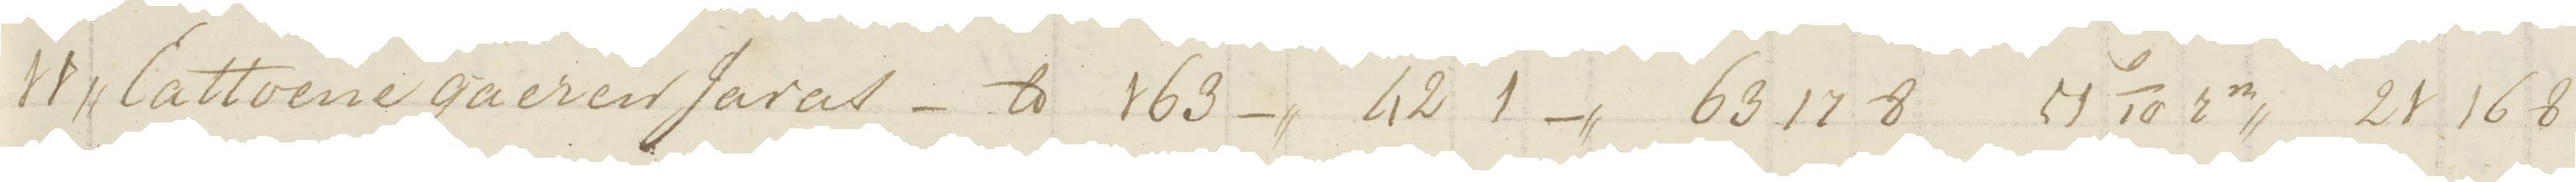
11 „ Cattoene gaeren Javas - lb 163 -„ 42 1 - „ 63 17 8: 51 9/10 rm 21 16 8
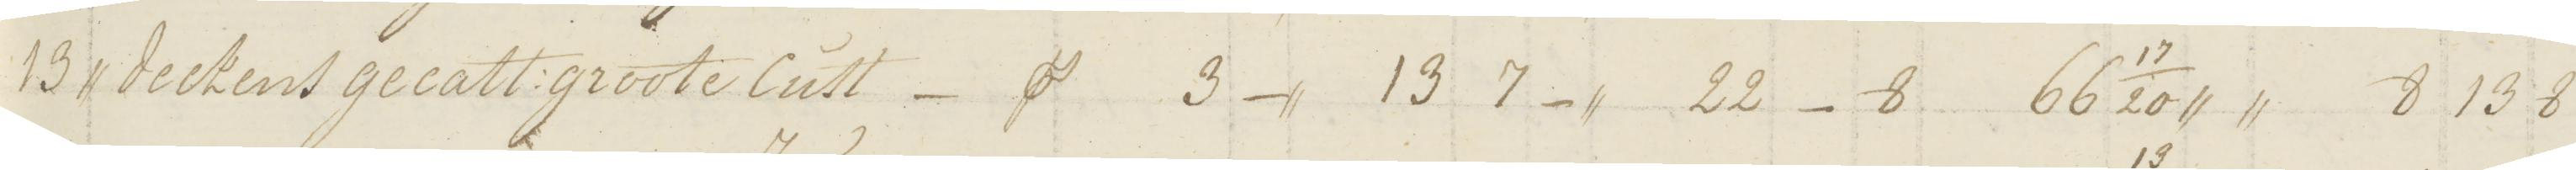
13 „ deekens gecatt: groote Cust - ps 3 -„ 13 7 - „ 22 - 8 66 17/20 „ „ 8 13 8
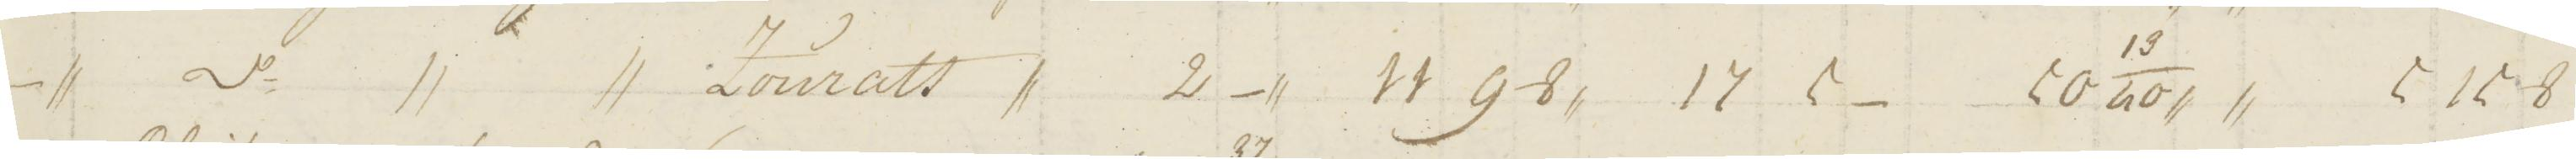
-„ d=o „ „ Zourats „ 2 - „ 11 98 „ 17 5 - 50 19/40 „ „ 5 15 8
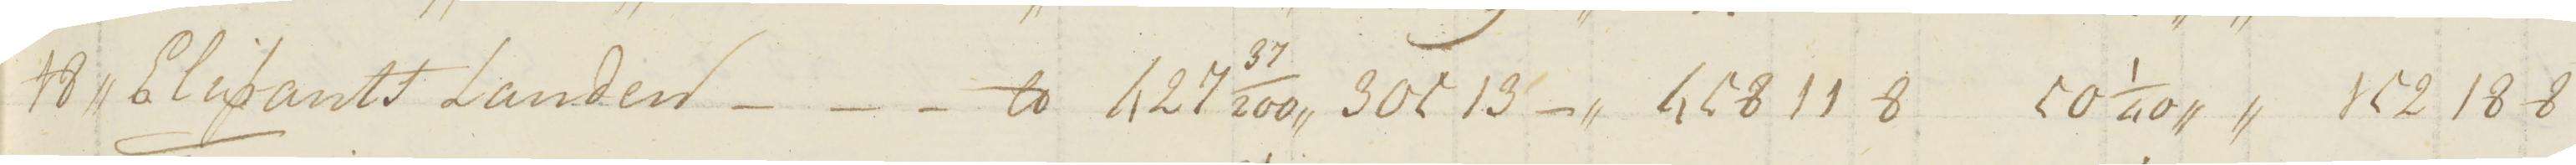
18 „ Elipants Landen - - - lb 427 37/200 „ 305 13 - „ 458 11 8 50 1/40 „ „ 152 18 8
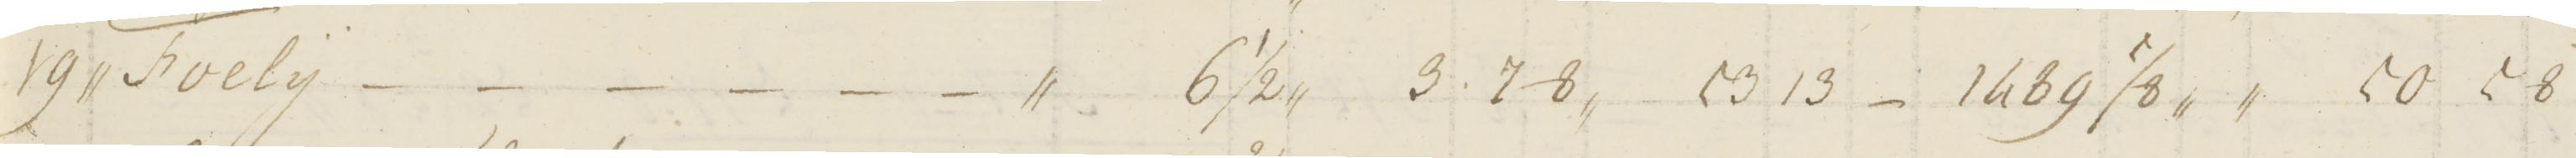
19„ Foelij - - - - - - „ 6½ „ 3: 7 8 „ 53 13 — 1489 5/8 „ „ 50 5 8
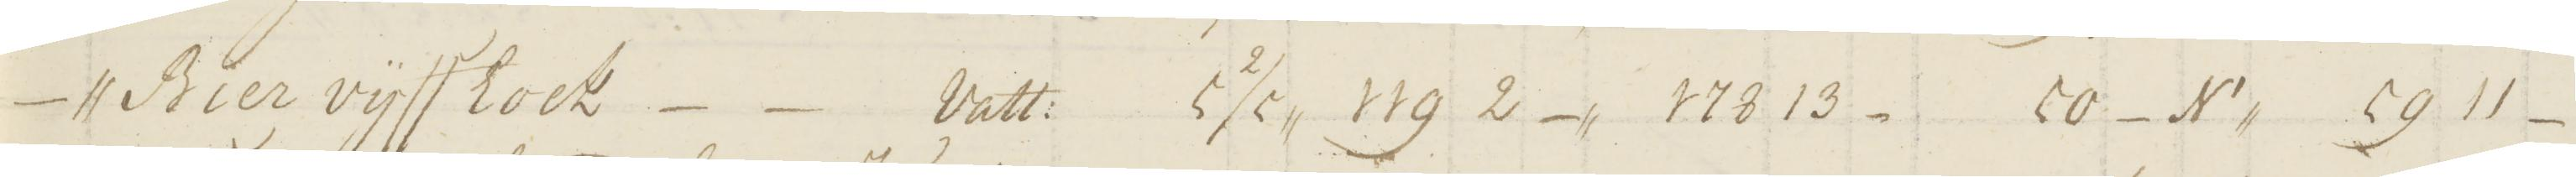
- „ Bier vijffhoek - - Vatt: 5 2/5 „ 119 2 - „ 178: 13 - 50: - N „ 59 11 -
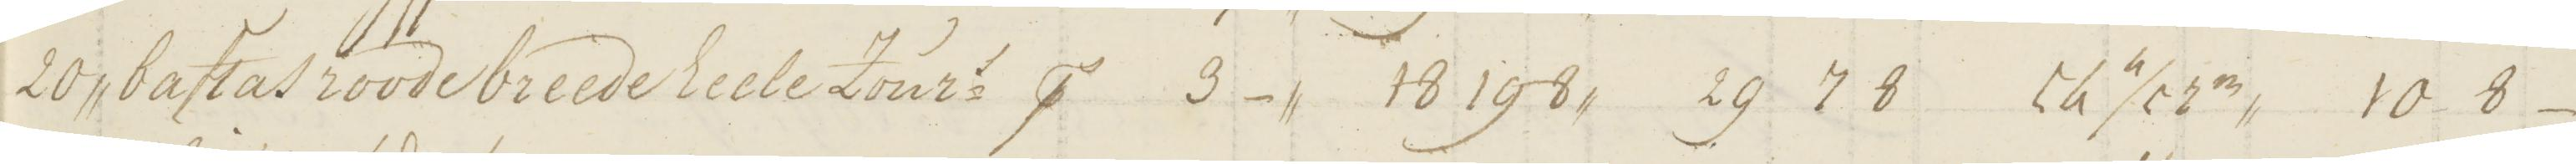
20 „ baftas roode breede heele Zour=s ps 3 - „ 18 198 „ 29 7 8 54 4/5 rm „ 10 8 -
